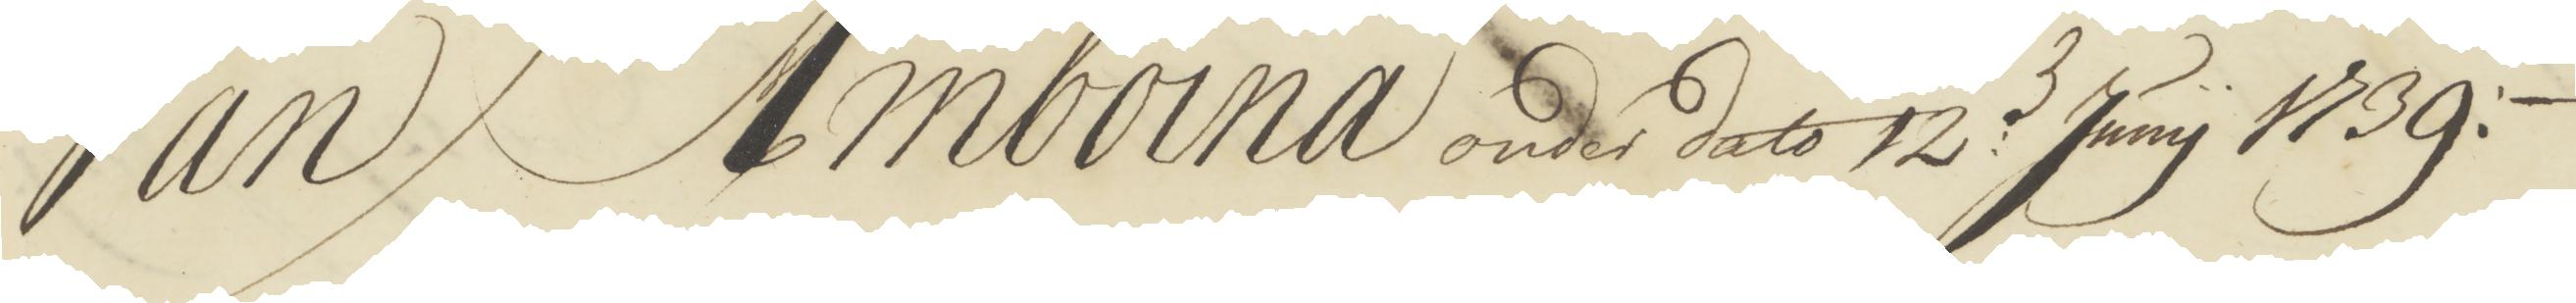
Van Amboina onder dato 12:' Junij 1739: —
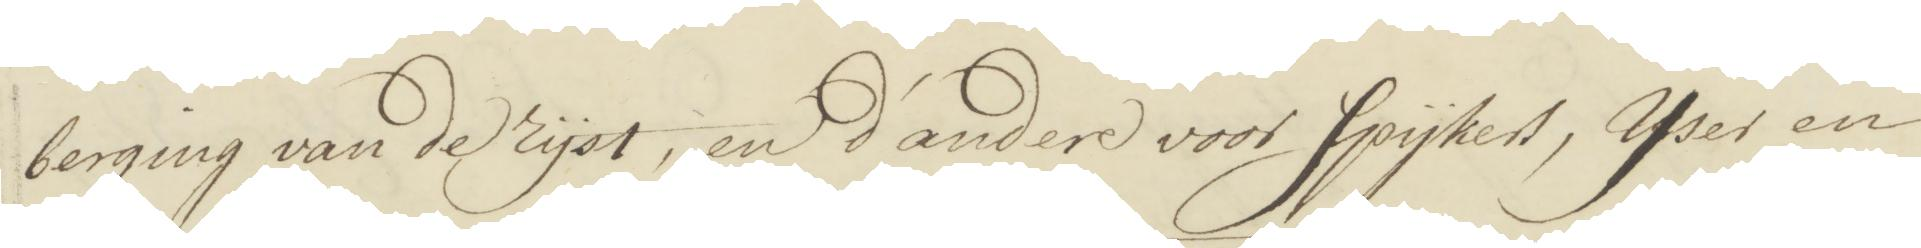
berging van de rijst, en d’andere voor spijkers, Yser en
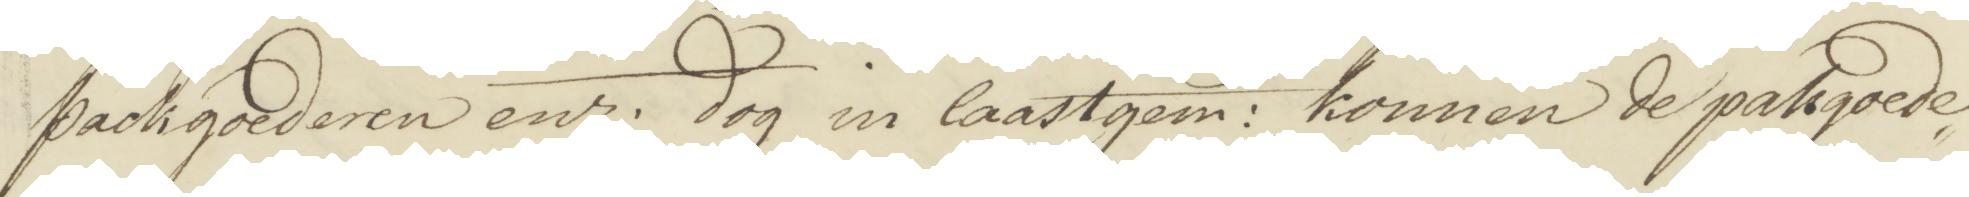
packgoederen enz: dog in laastgem: konnen de pakgoede„
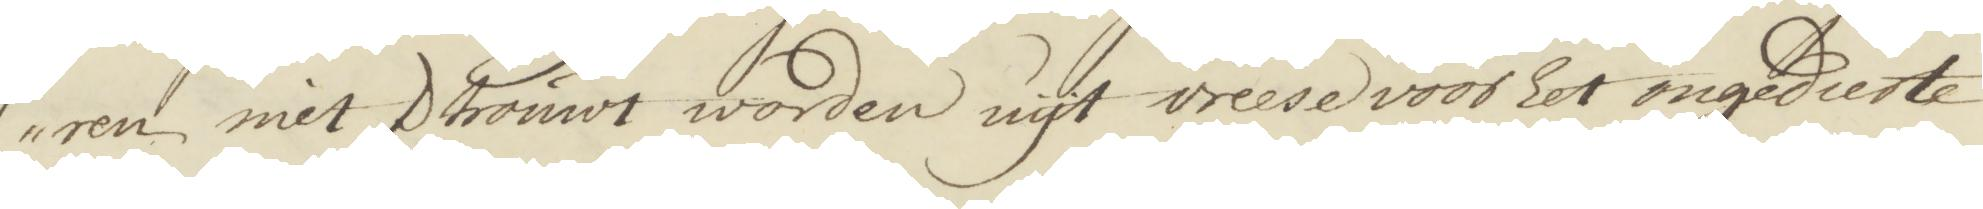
„ren niet vertrouwt worden uijt vreese voor het ongedierte
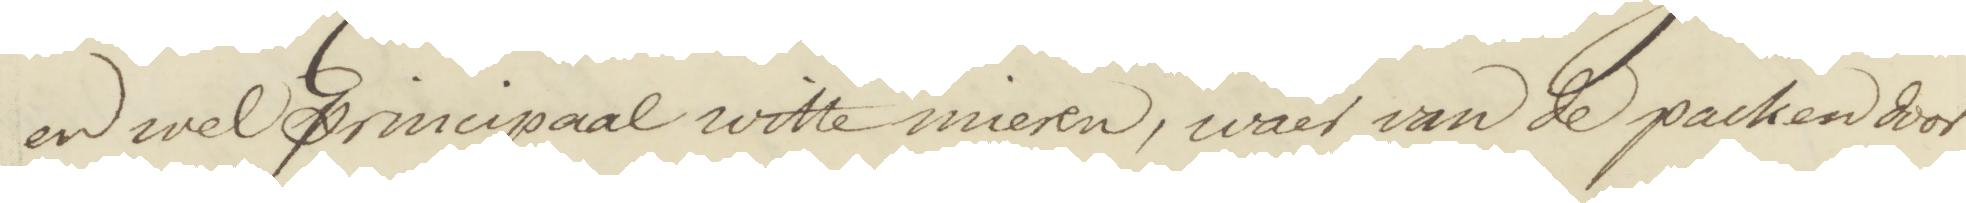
en wel principaal witte mieren, waer van de packen door
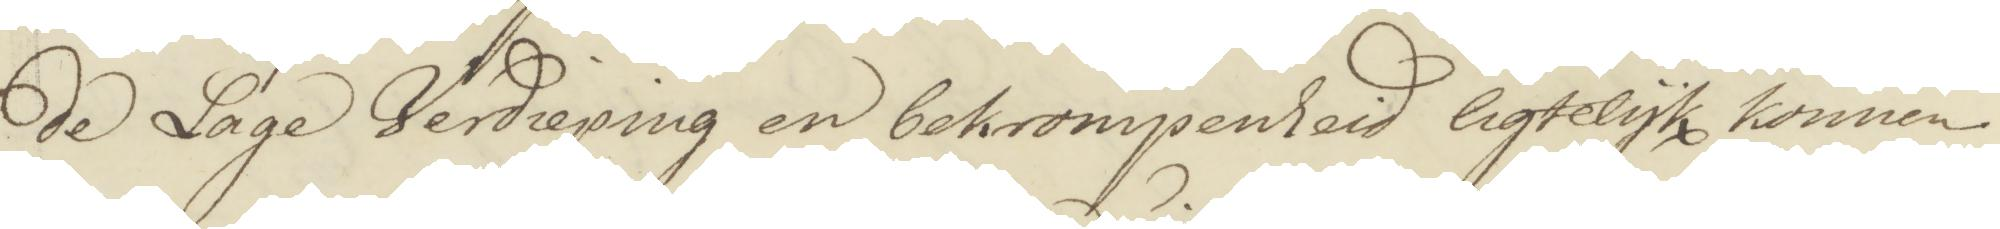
de Lage Verdieping en bekrompenheid ligtelijk konnen
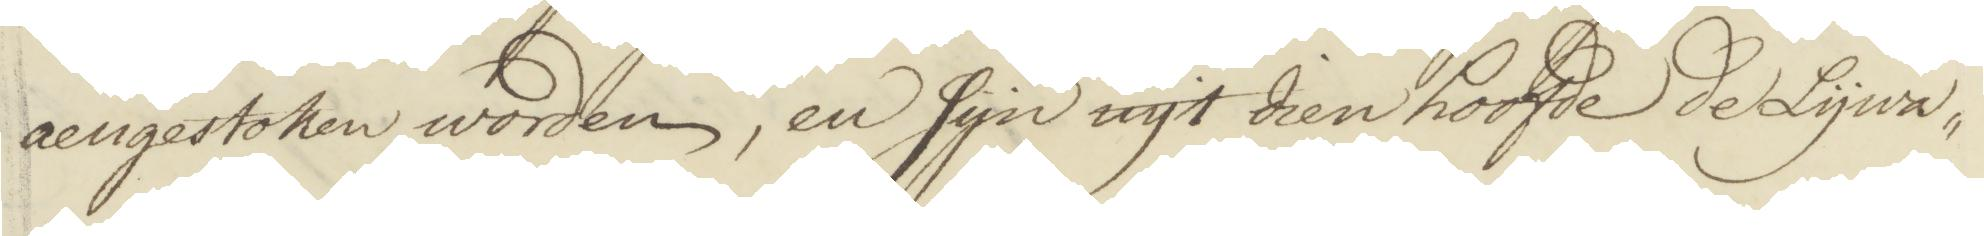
aengestoken worden, en sijn uijt dien hoofde de Lijwa„
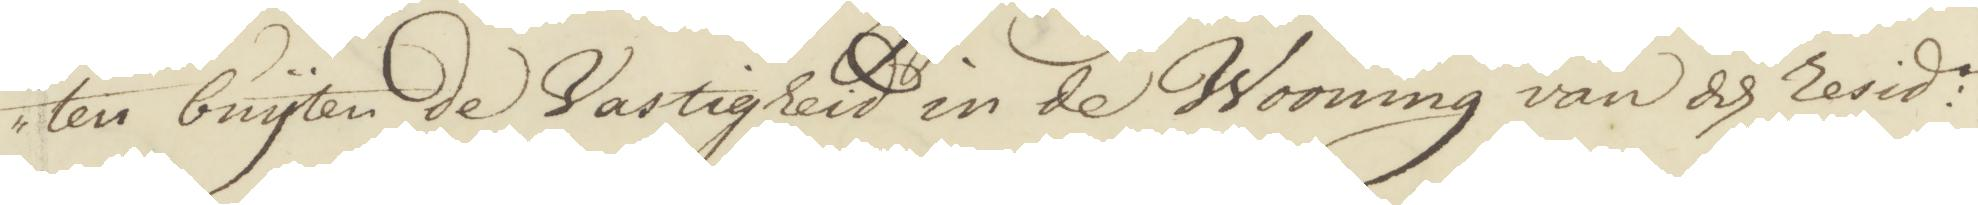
„ten buijten de Vastigheid in de Wooning van den resid:t
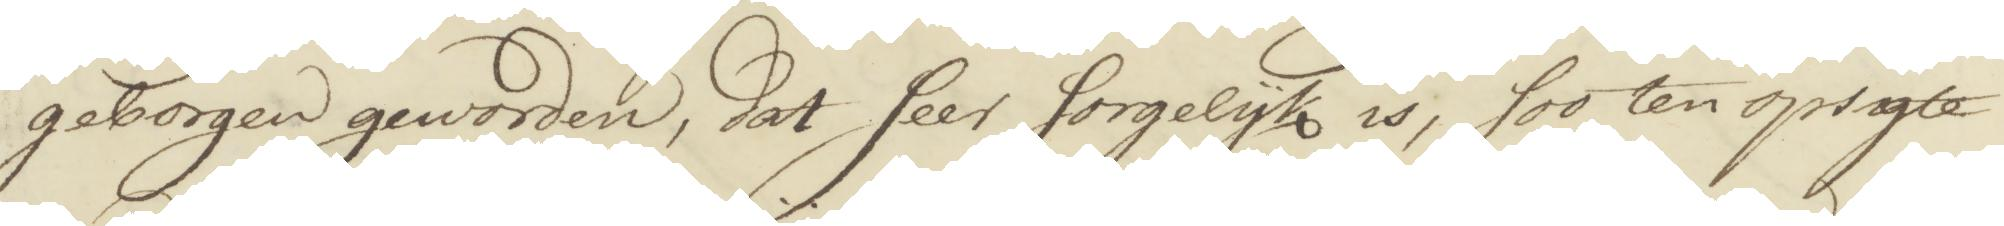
geborgen geworden, dat seer sorgelijk is, soo ten opsigte
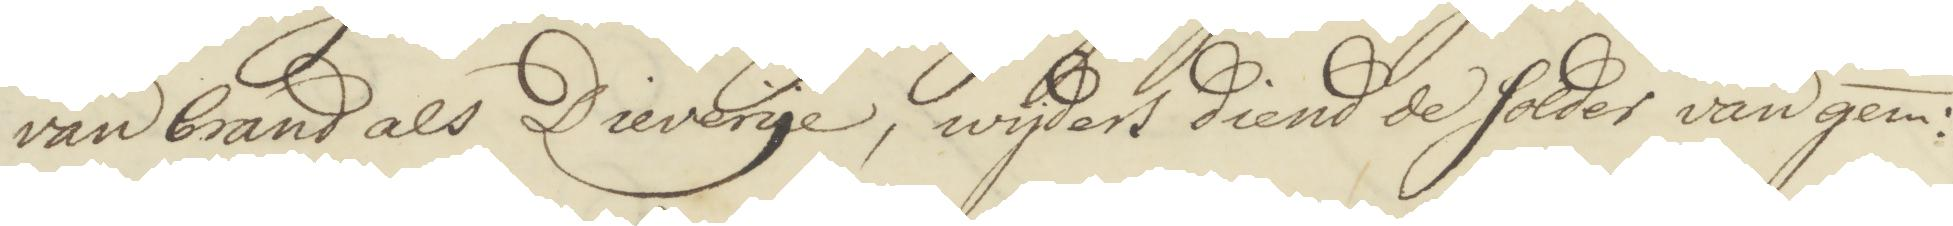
van brand als Dieverije, wijders diend de solder van gem:
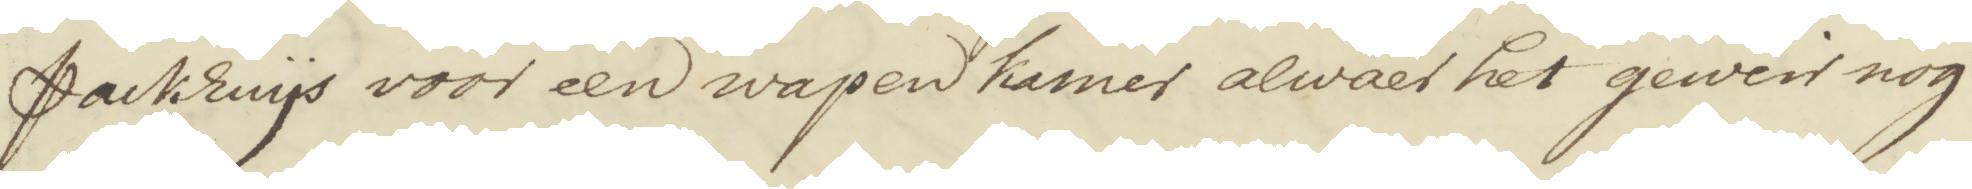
packhuijs voor een wapen kamer alwaer het geweir nog
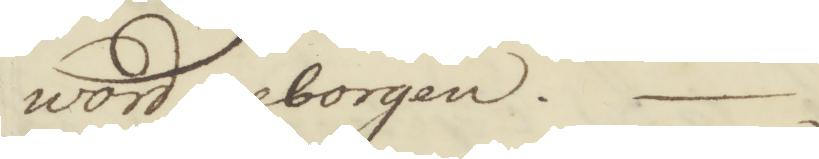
word geborgen. —
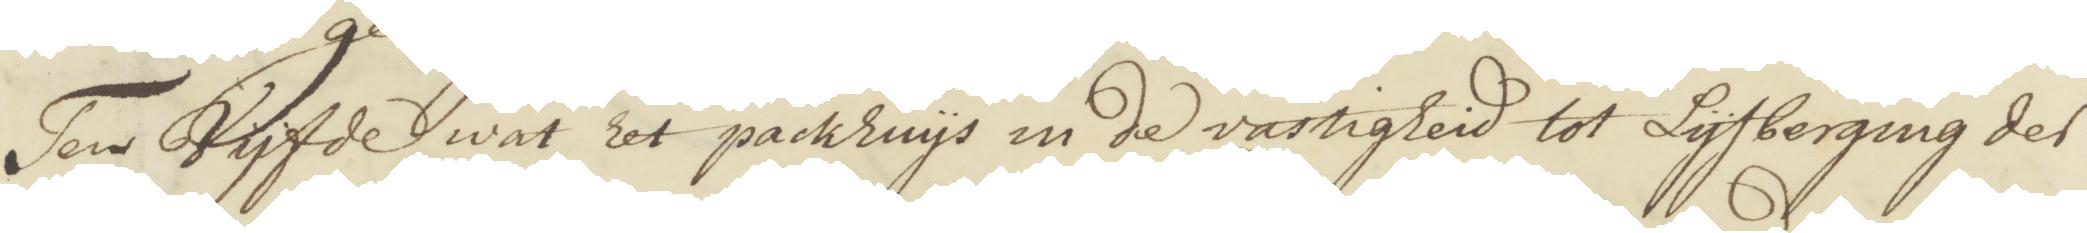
Ten vijfde wat het packhuijs in de vastigheid tot Lijfberging des
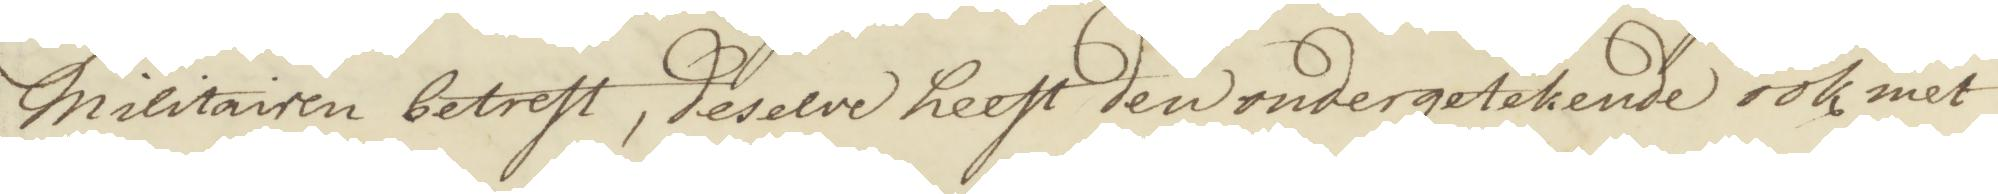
militairen betreft, deselve heeft den ondergetekende ook met
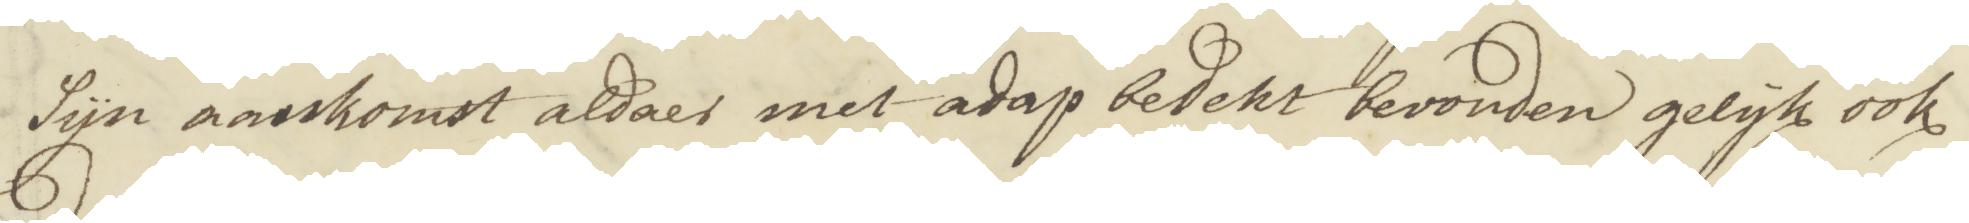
sijn aankomst aldaer met adap bedekt bevonden gelijk ook
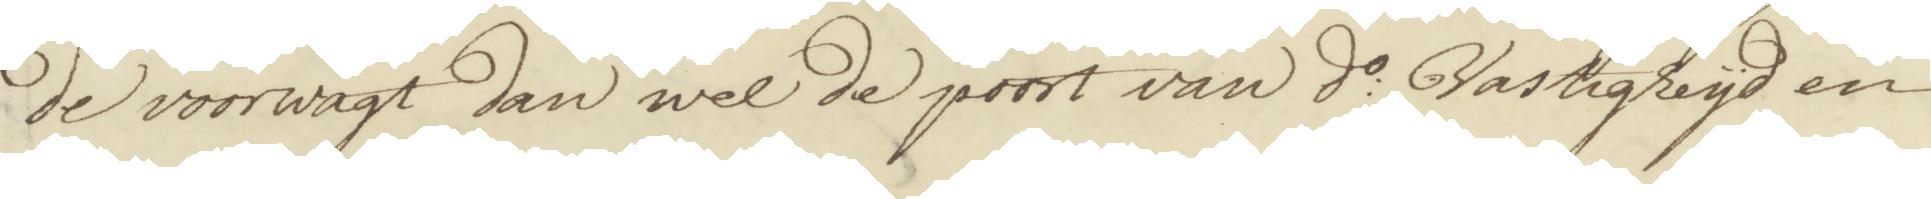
de voorwagt dan wel de poort van d:o Vastigheijd en
